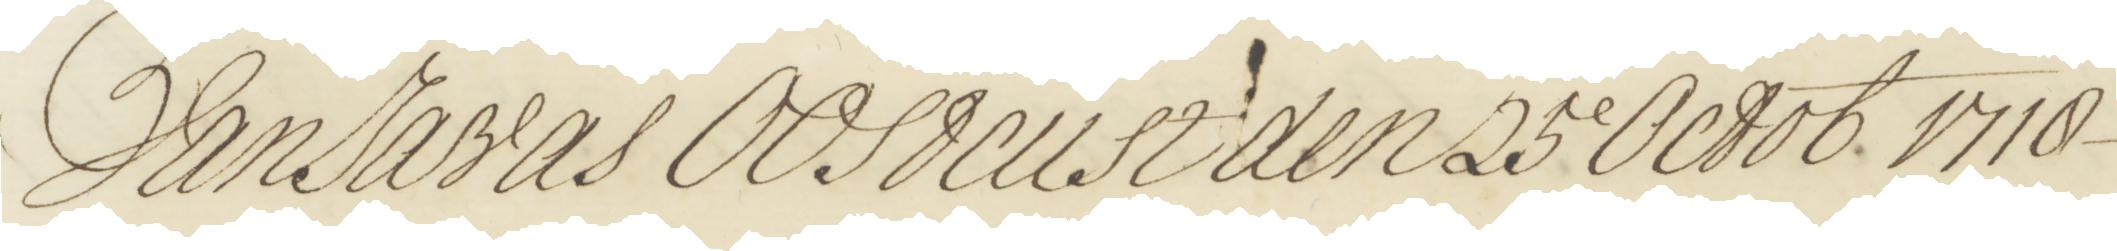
Van Javas Oostcust den 25 Octob 1718
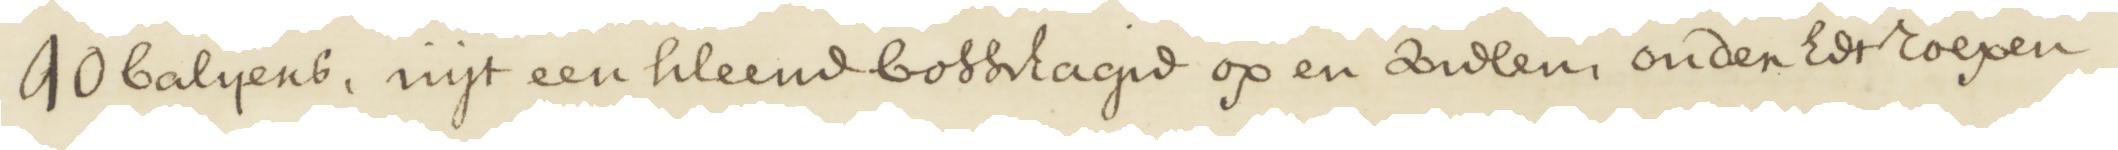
40 balijers, uijt een kleene bosschagie op en vielen, onder het roepen
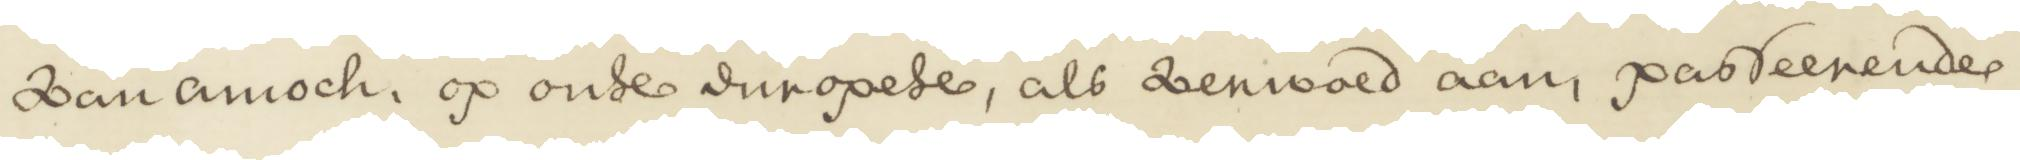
van amock, op onse europese, als verwoed aan, passeerende
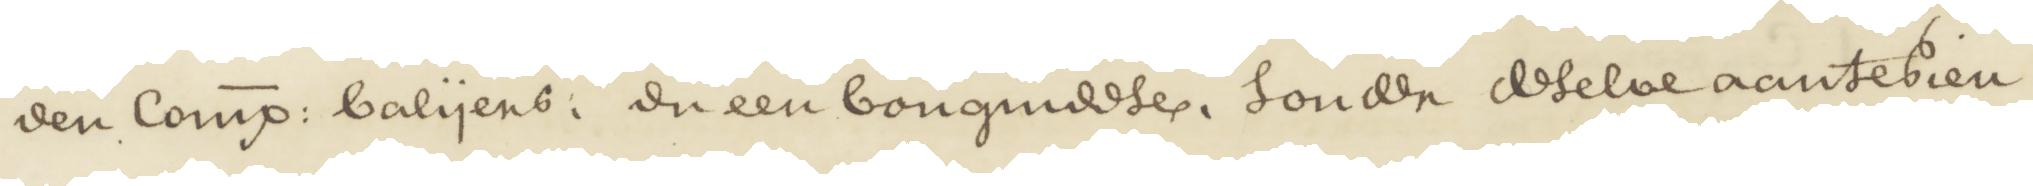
een Comp: balijers: en een bougineese, Sonder deselve aantesien
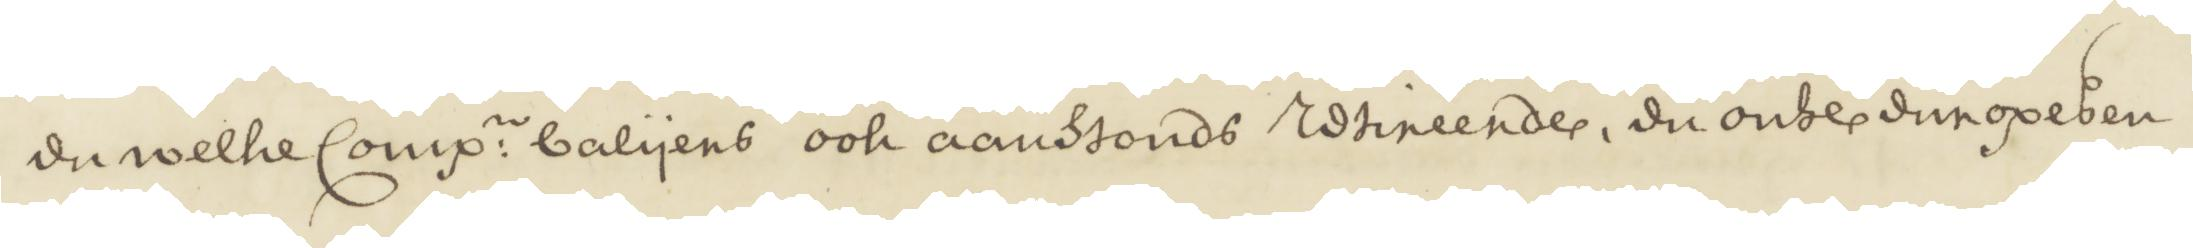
en welke Comp:e balijers ook aanstonds retireerde, en onse europesen
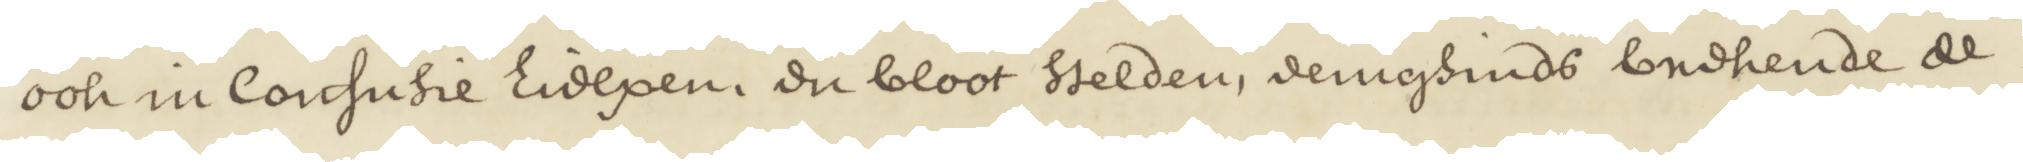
ook in confusie hielpen, en bloot stelden, eenigsinds brekende de
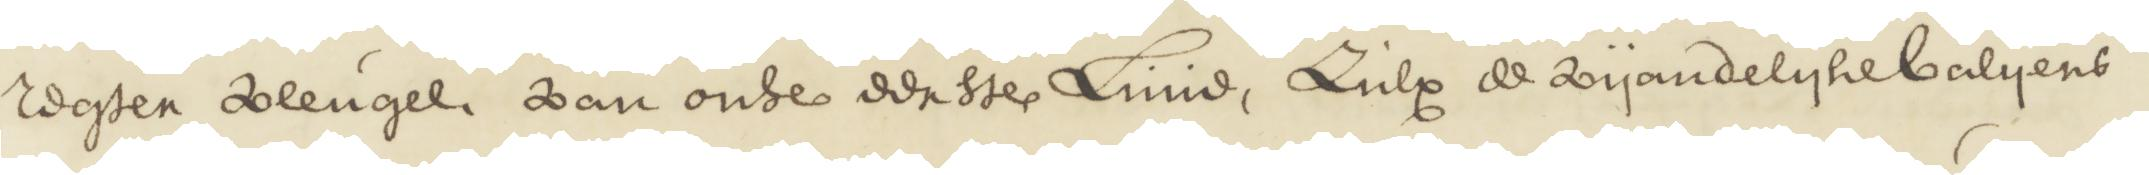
regter vleugel, van onse eerste Linie, Zulx de vijandelijke balijers
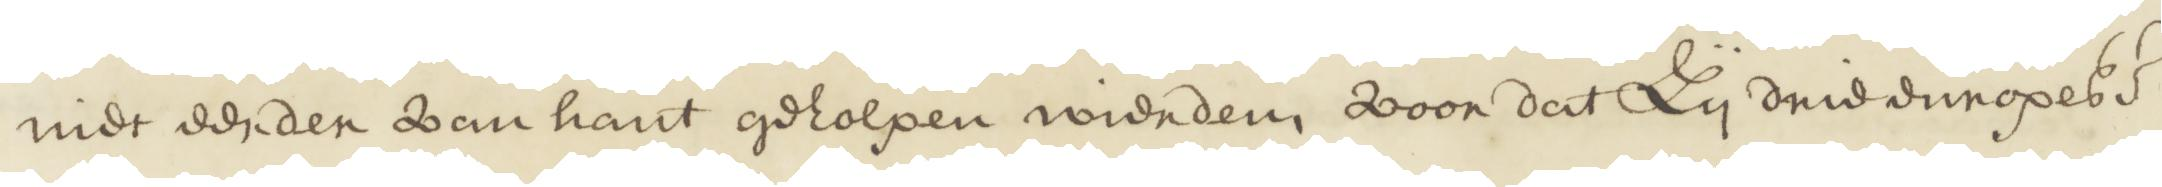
niet eender van kant geholpen wierden, voor dat Zij drie europese
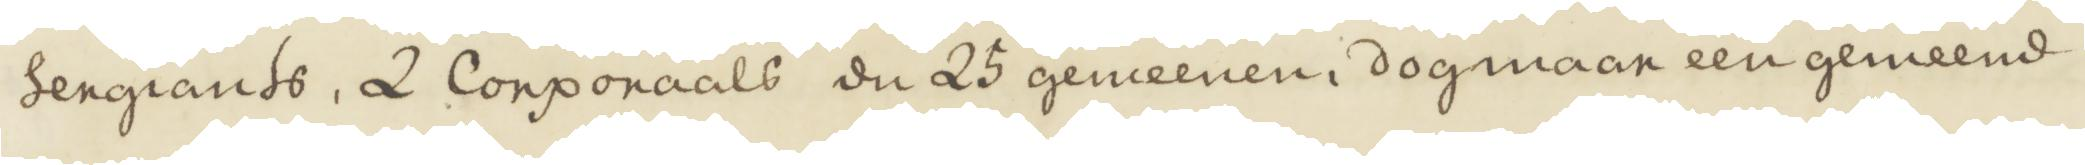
sergiants, 2 Corporaals en 25 gemeenen, dog maar een gemeene
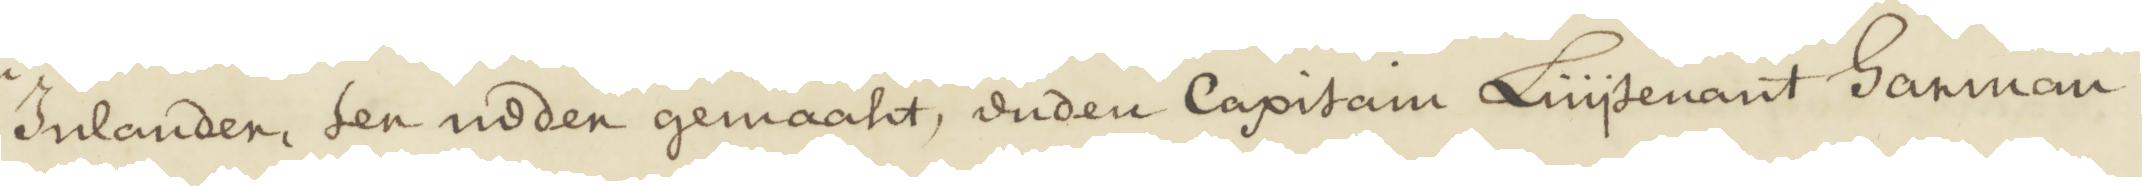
Inlander, ter neder gemaakt, en den Capitain Luijtenant Harman
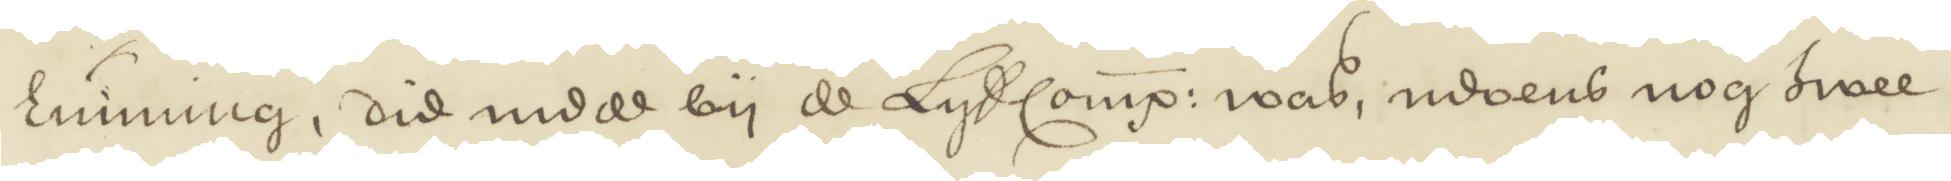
hunning, die mede bij de Lyf Comp: was, nevens nog twee
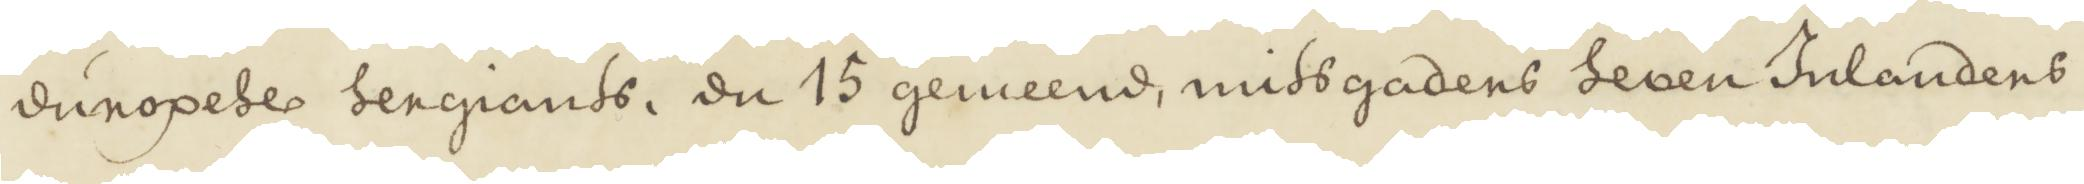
europese sergiants, en 15 gemeene, mitsgaders seven Inlanders
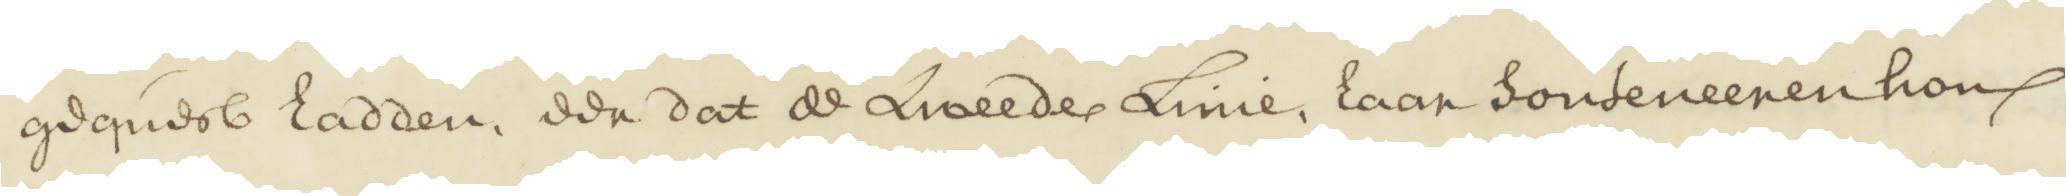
gequest hadden, eer dat de tweede Linie, haar souteneeren kon
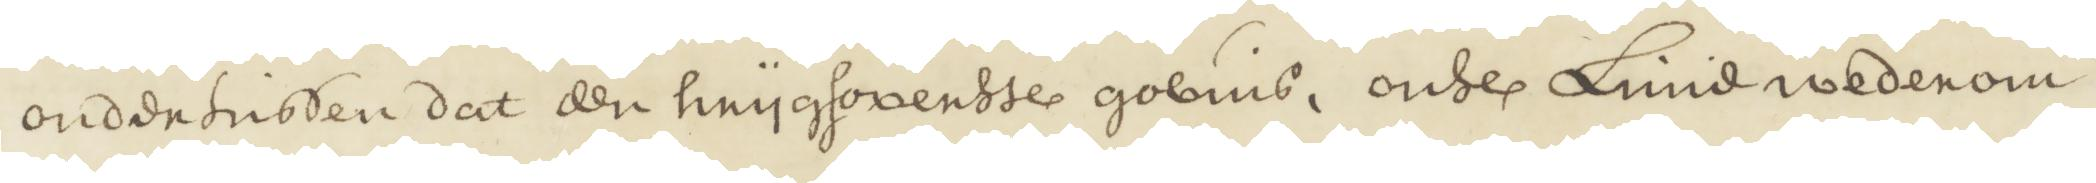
ondertussen dat den krijgsoverste gobuis, onse Linie wederom
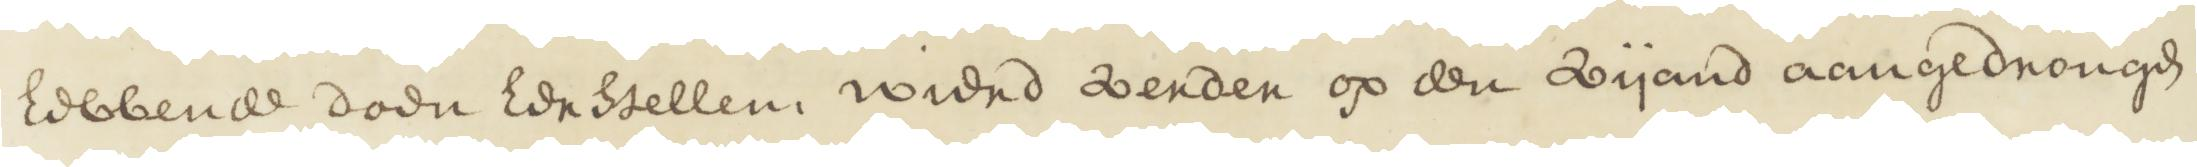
hebbende doen herstellen, wierd verder op den vijand aangedrongen
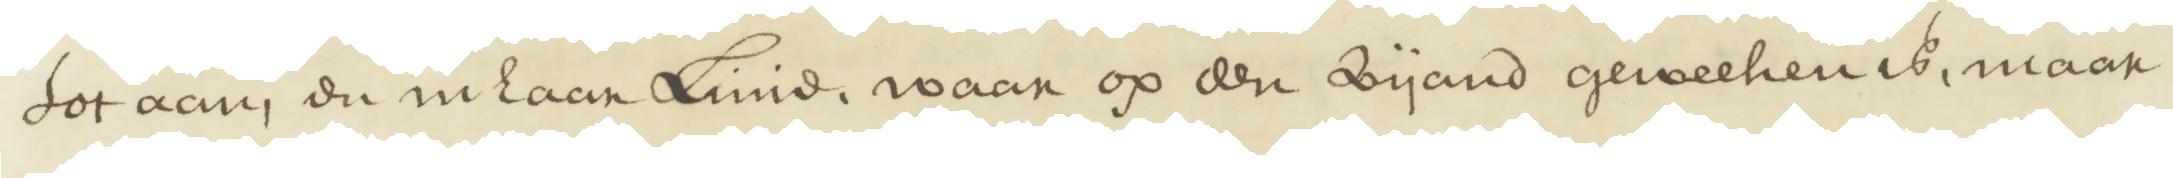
tot aan, en in haar Linie, waar op den vijand geweeken is, maar
